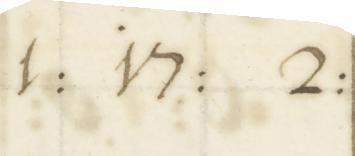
1: 17: 2:
